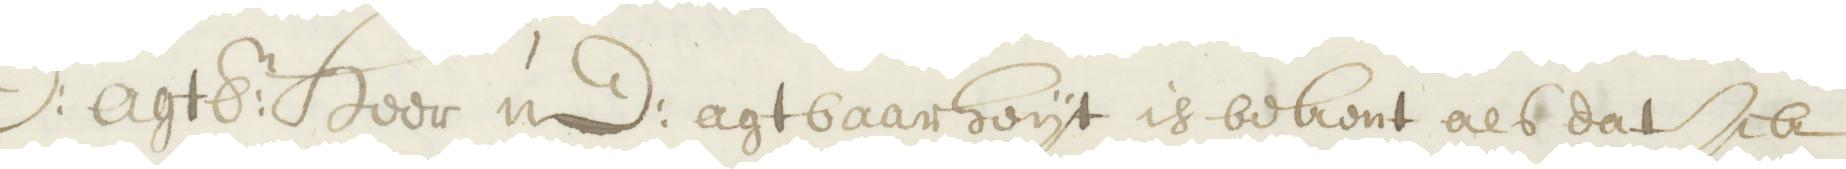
E: agtb: Heer uE: agtbaarheijt is bekent als dat Jck
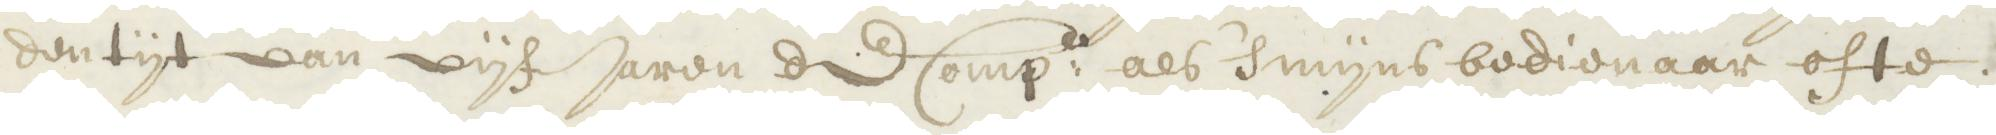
den tijt van vijf Jaren dE Comp:e als 'S mijns bedienaar ofte
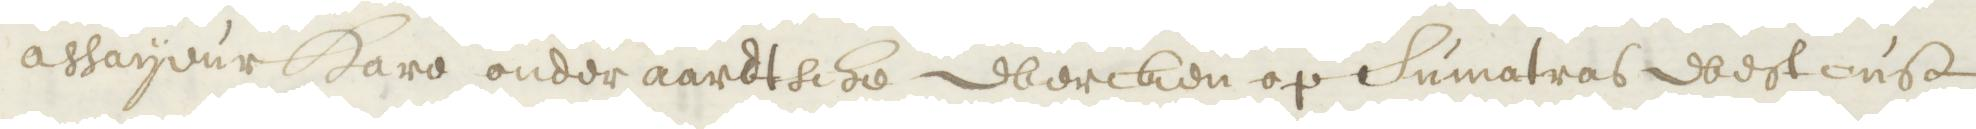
assaijeur Hare onder aardtsche wercken op Sumatras west cust
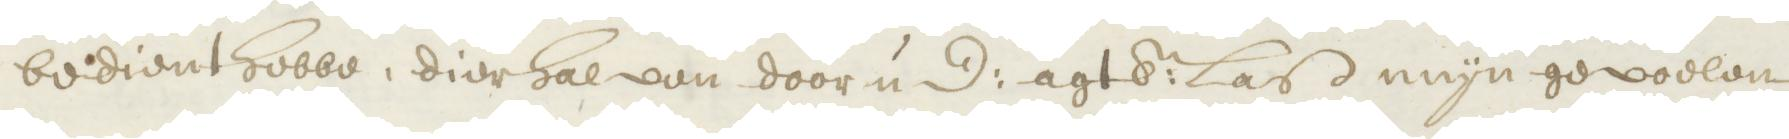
bedient hebbe, dierhalven door u E: agtb:' Last mijn gevoelen
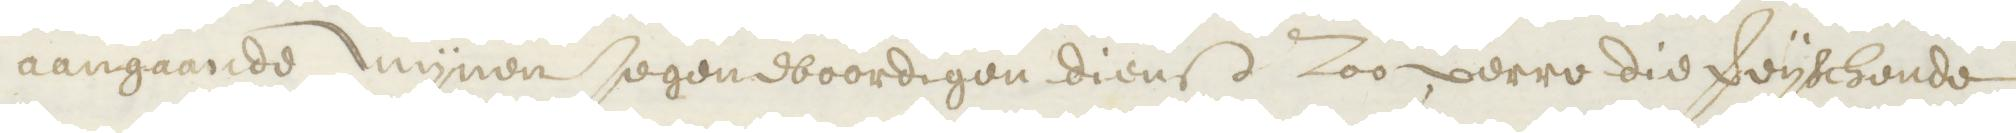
aangaande mijnen Jegenwoordigen dienst Zoo verre die Vereijschende
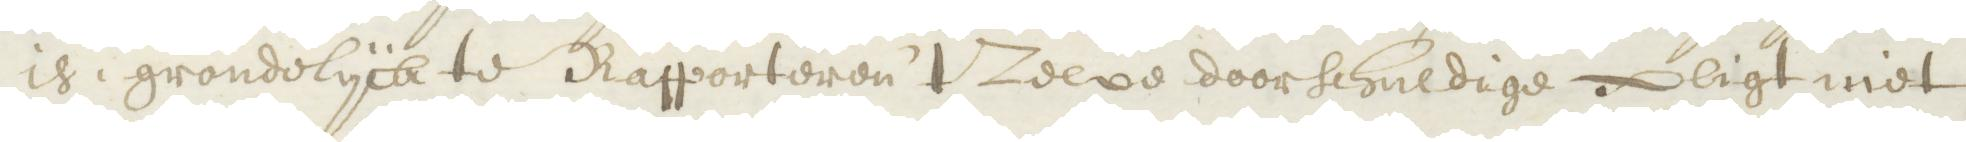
is, grondelijck te Rapporteren ’t Zelve door schuldige pligt niet
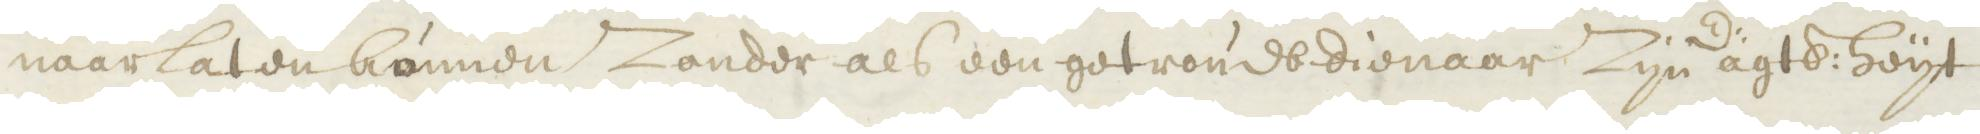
naar laten konnen Zonder als een getrouw dienaar Zijn agtb:heijt
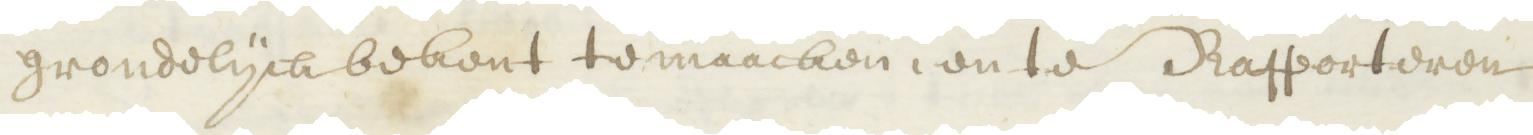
grondelijck bekent te maacken, en te Rapporteren
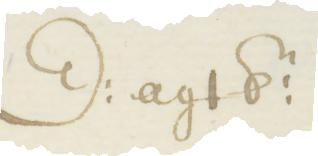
E: agtb:e
